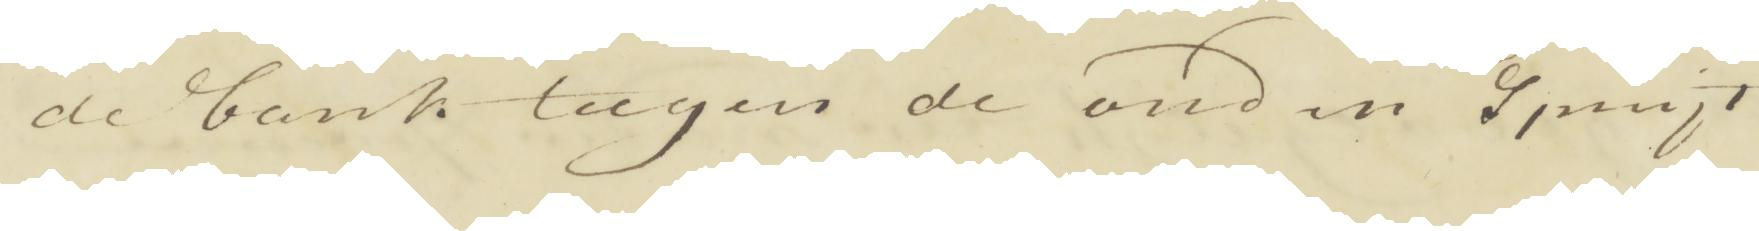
de bank teegen de ouden spuijt
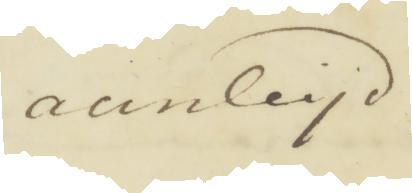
aanleijd
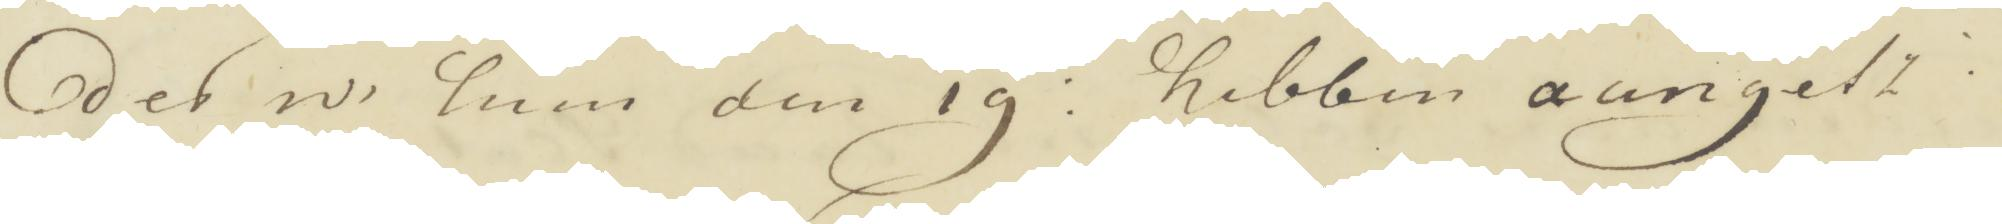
des w' hun den 19:' hebben aangesz:
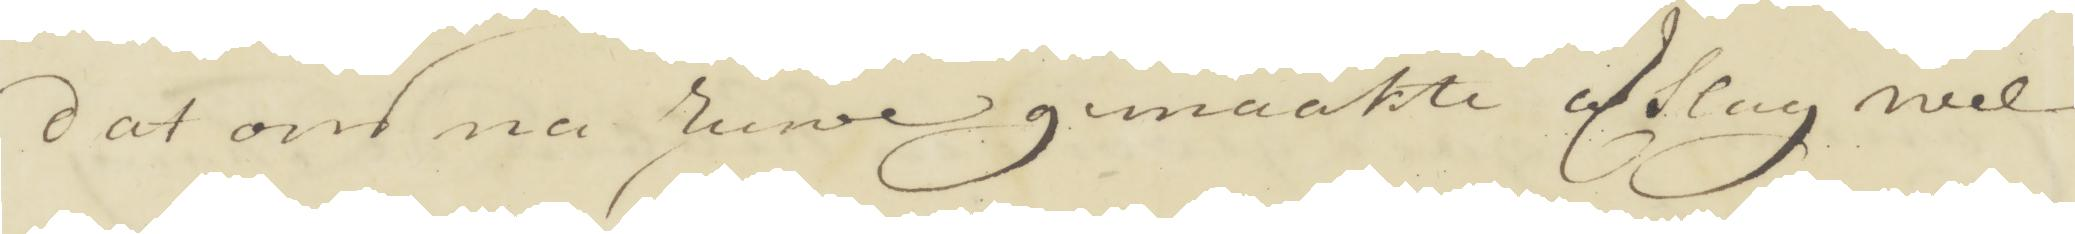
dat ons na ruwe gemaakte verslag wel
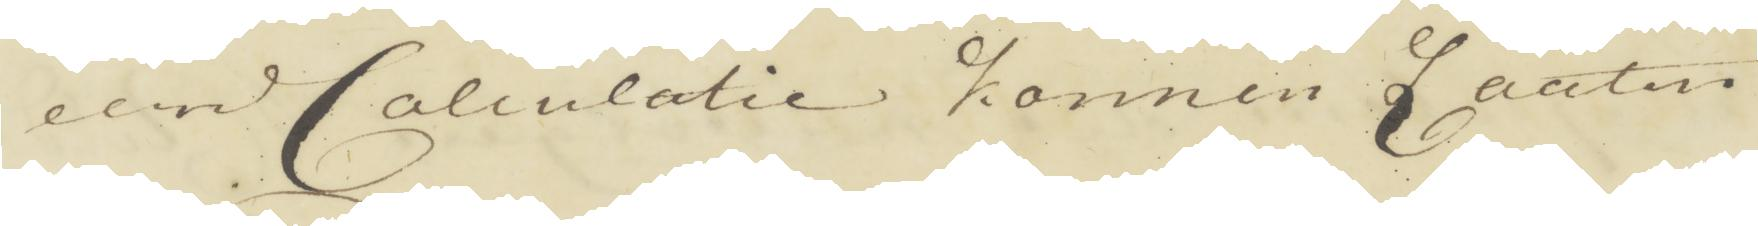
een Calculatie konnen laaten
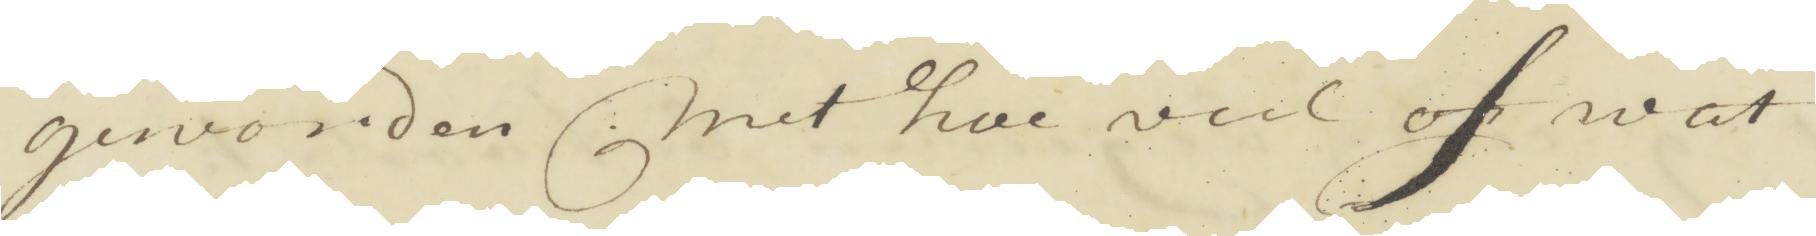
geworden met hoe veel of wat
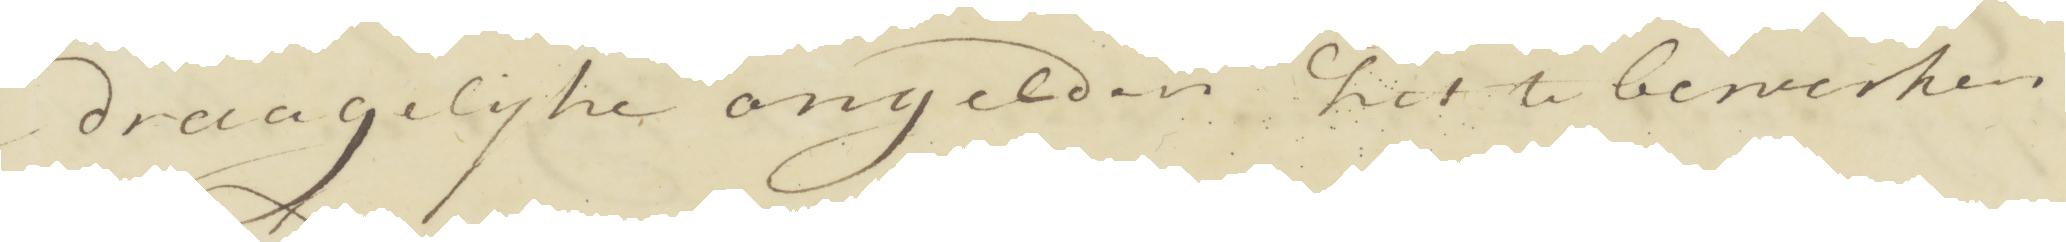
draagelijke ongelden het te bewerken
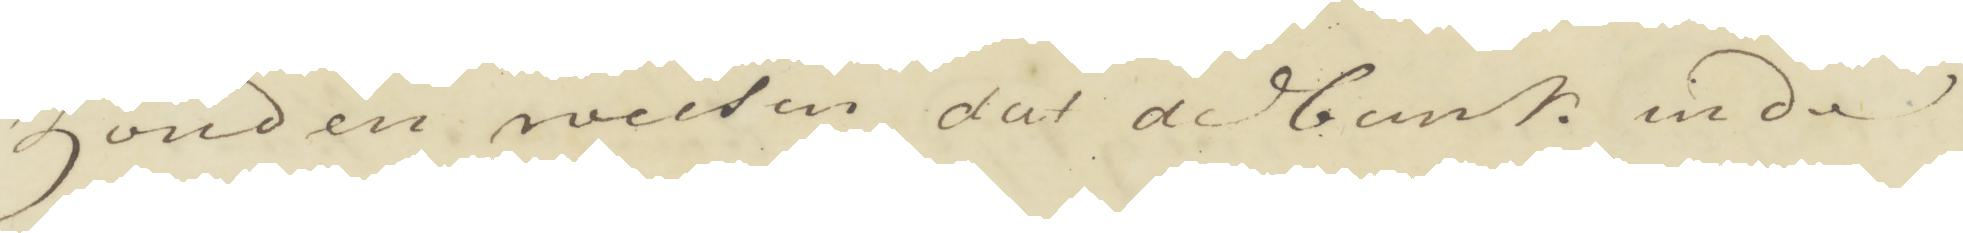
zouden weesen dat de bank in de
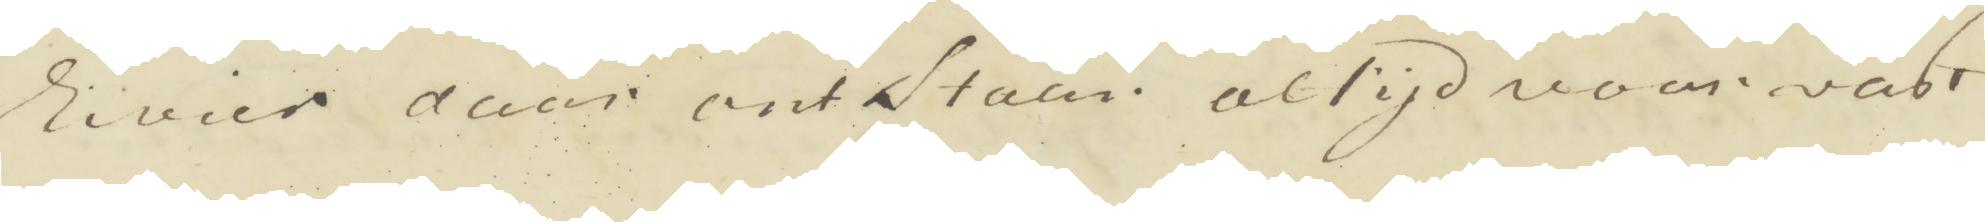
rivier daar ontstaan altijd voor vast
